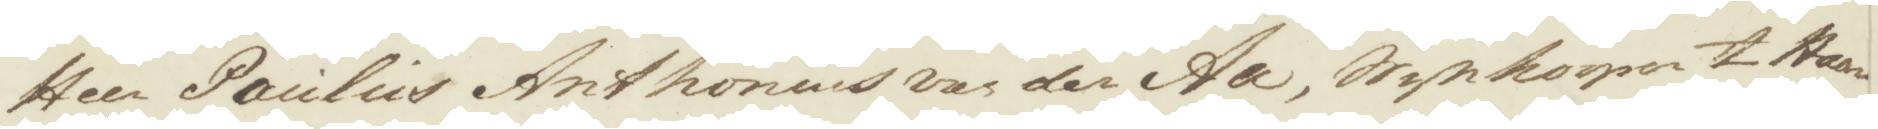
Heer Paulus Anthonius van der Aa, Wynkooper te Haar
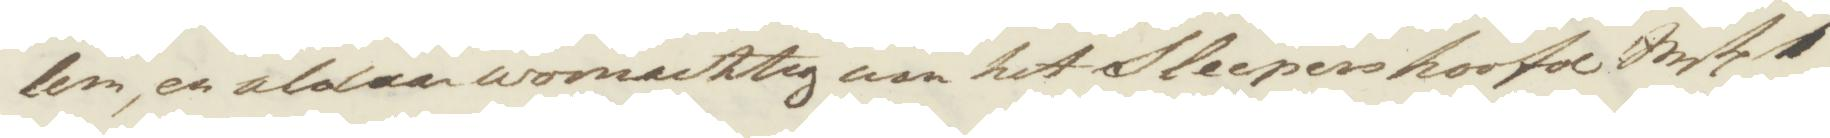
lem, en aldaar woonachtig aan het Sleepershoofd Wyk 1
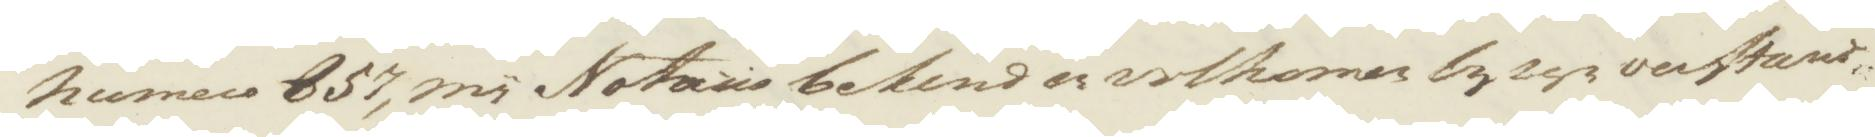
numero 657, mij Notaris bekend en volkomen by zyn verstand
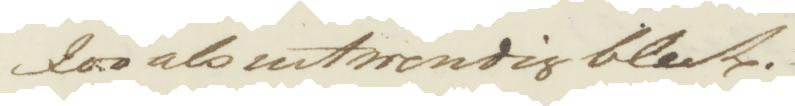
Zoo als uitwendig bleck.
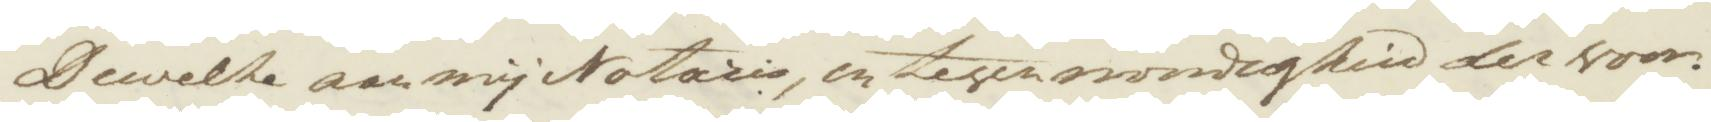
Dewelke aan mij Notaris, in tegenwoordigheid der voor„
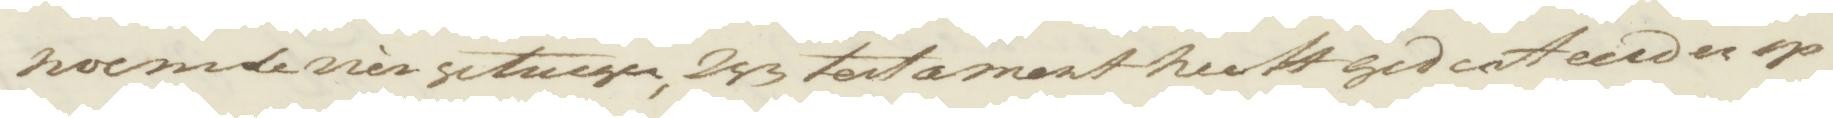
noemde vier getuigen, zyn testament heeft gedicteerd en op
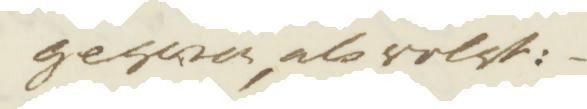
gegeven, als volgt:
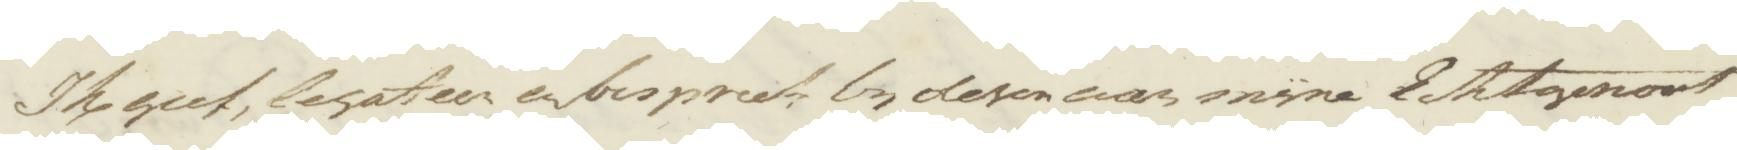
Ik geef, legateer en bespreek by dezen aan mijne Echtgenoot
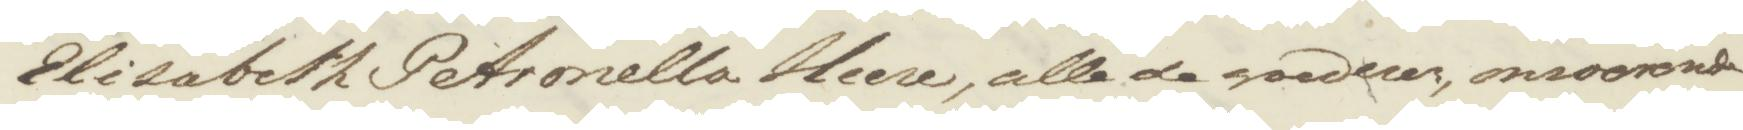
Elizabeth Petronella Heere, alle de goederen, onroerende
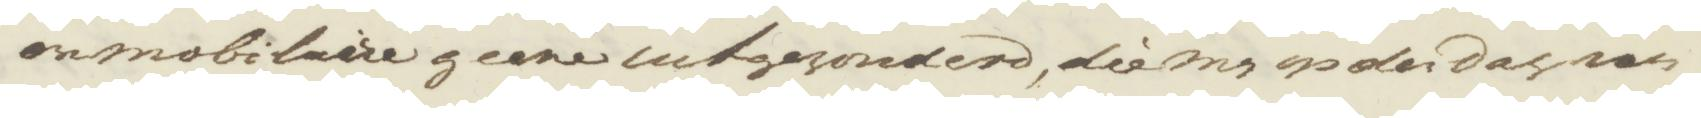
en mobilaire geene uitgezonderd, die my op den dag van
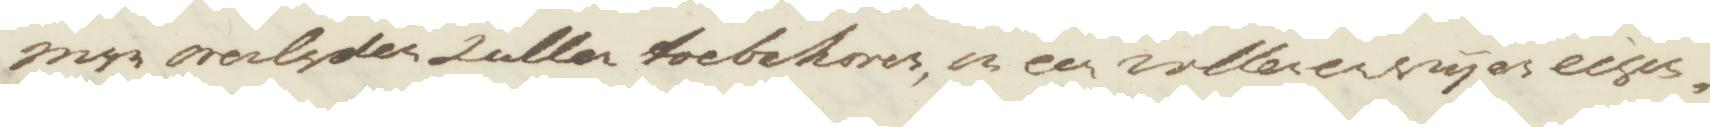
myn overlyden zullen toebehoren, in een vollen en vrijen eigen=
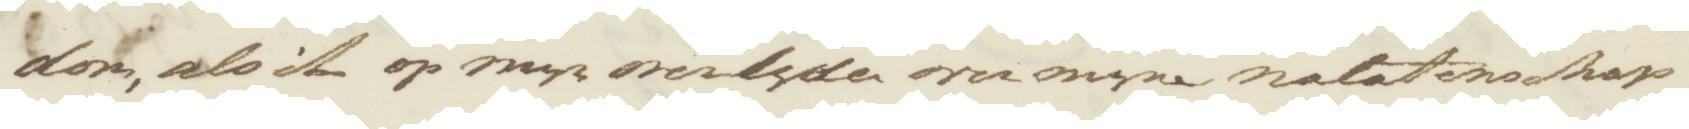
dom, als ik op myn overlyden over myne nalatenschap
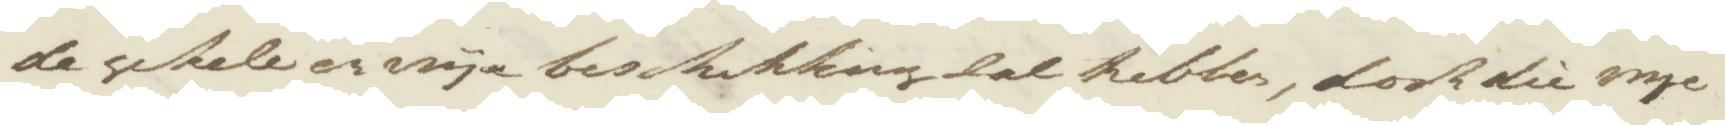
de gehele en vrye beschikking zal hebben, doch die vrye
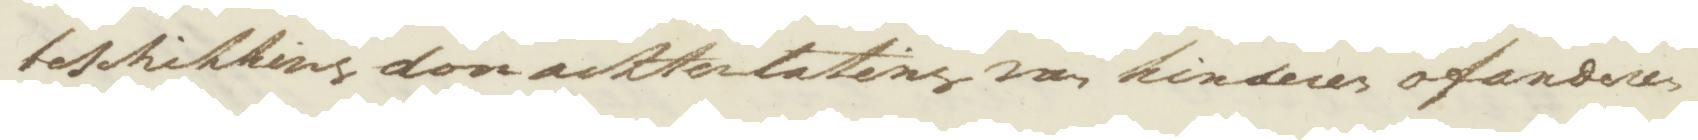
beschikking door achterlating van kinderen of anderen
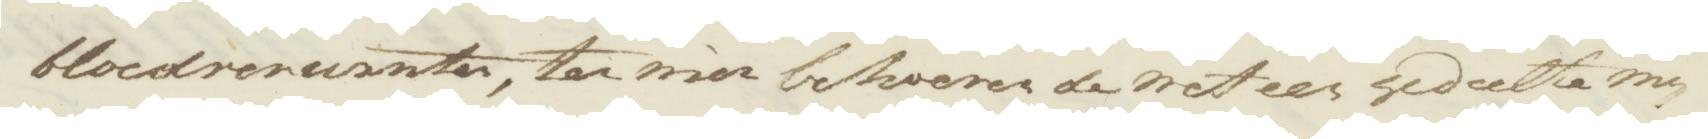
bloedverwanten, ter wier behoeven de wet een gedeelte my
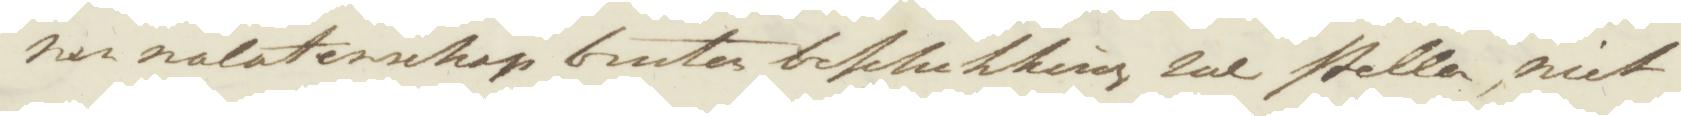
ner nalatenschap buiten beschikking zal stellen, niet
